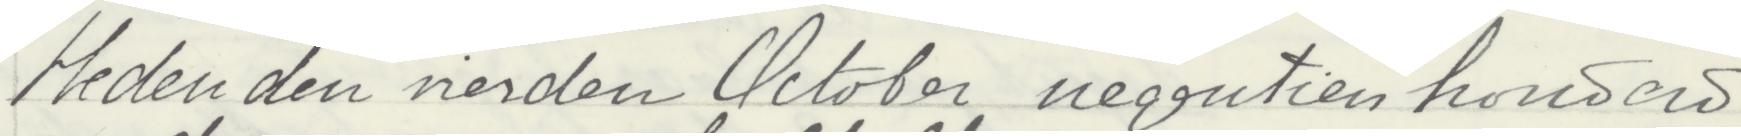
Heden den vierden October negentien honderd
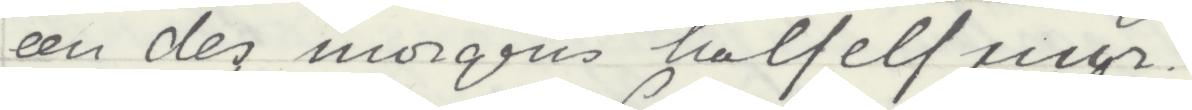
een des morgens half elf uur.
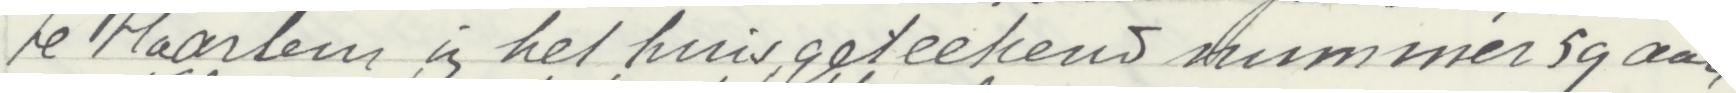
te Haarlem in het huis geteekend nummer 59 aan
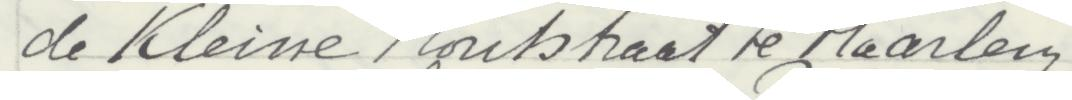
de Kleine Houtstraat te Haarlem
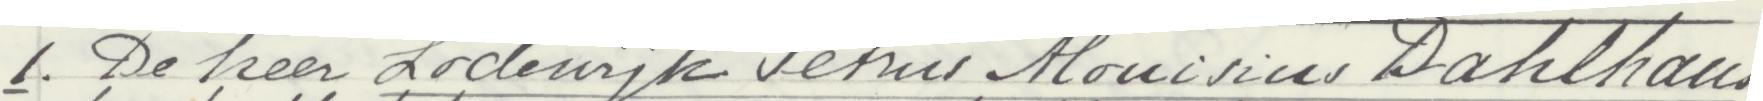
1. De heer Lodewijk Petrus Alouisius Dahlhaus
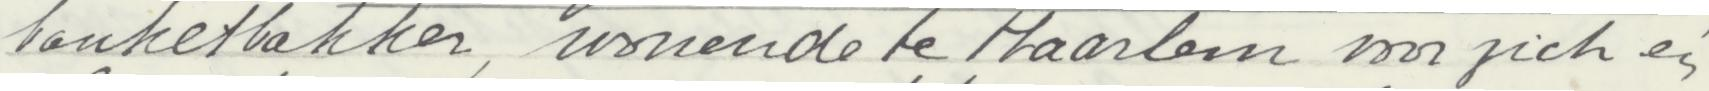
banketbakker, wonende te Haarlem voor zich en
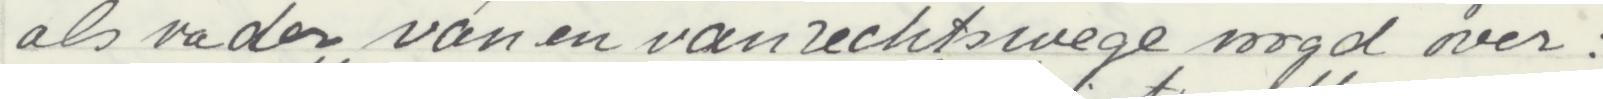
als vader van en van rechtswege voogd over
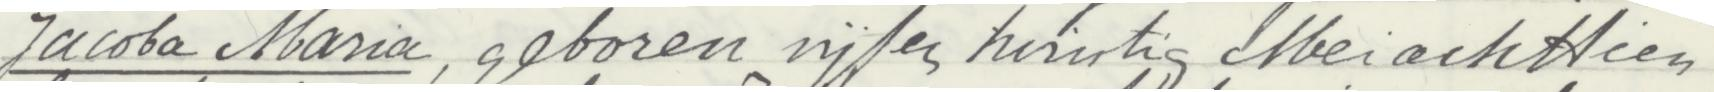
Jacoba Maria, geboren vijf en twintig Mei achttien
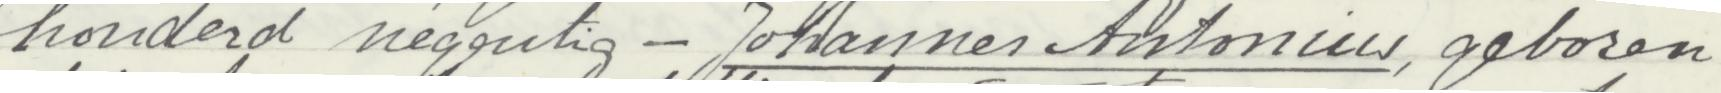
honderd negentig — Johannes Antonius, geboren
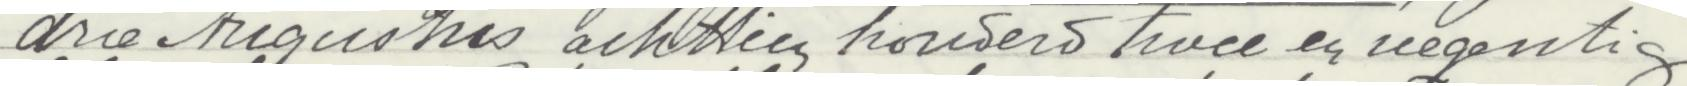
drie Augustus achttien honderd twee en negentig
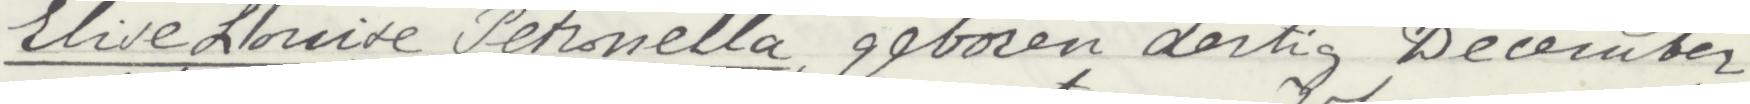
Elise Louise Petronella, geboren dertig December
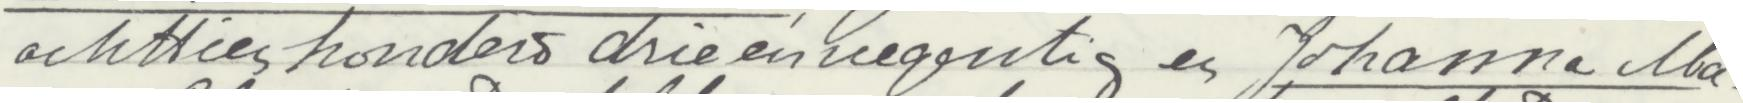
achttien honderd drie en negentig en Johanna Ma
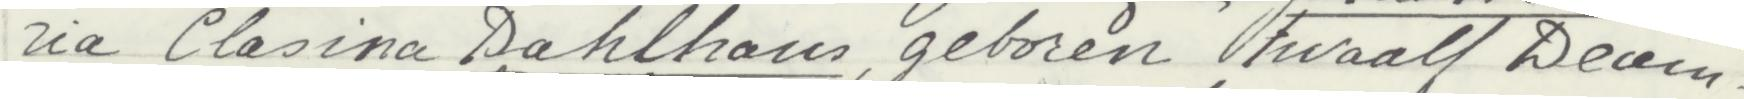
ria Clasina Dahlhaus, geboren Twaalf Decem
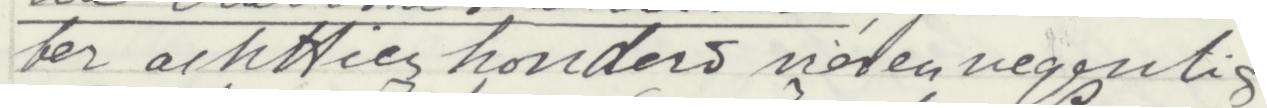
ber achttien honderd vier en negentig
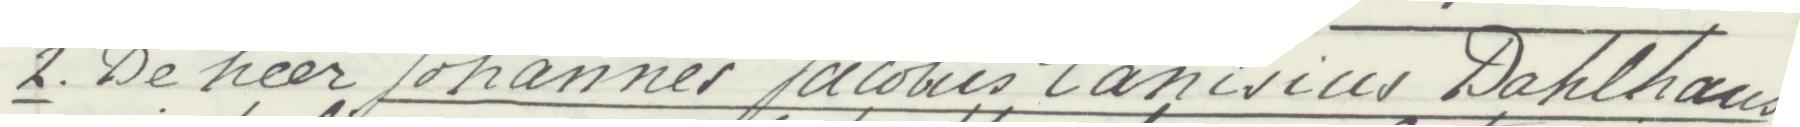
2. De heer Johannes Jacobus Canisius Dahlhaus,
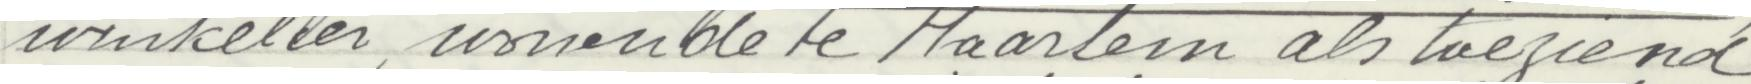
winkelier, wonende te Haarlem als toeziend
